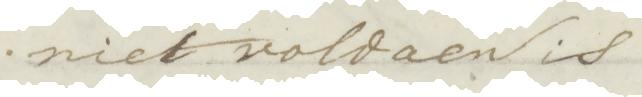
niet voldaen is
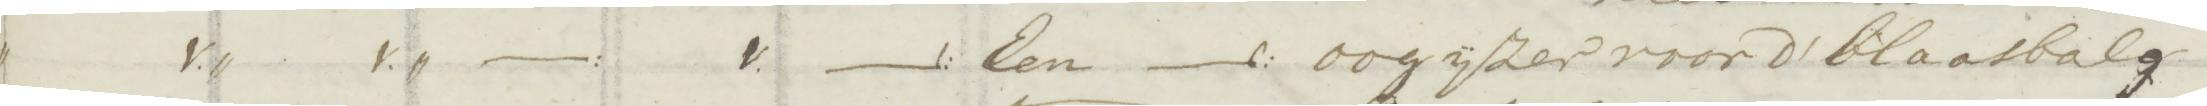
„ 1.„ 1„ 1. —: 1 _: Een _: oog ijzer voor d'blaasbalg
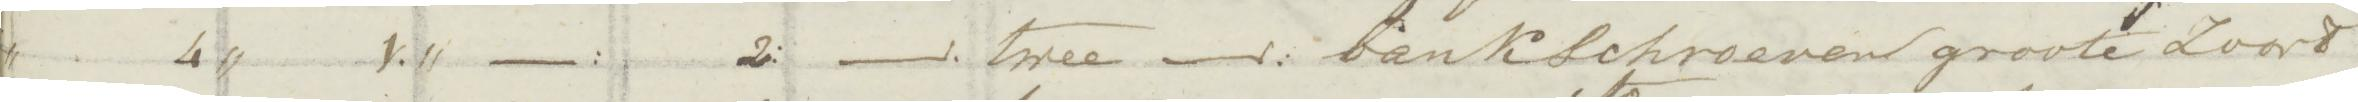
„ 4„ 1.„ —: 2: _: twee _: bankschroeven groote zoort
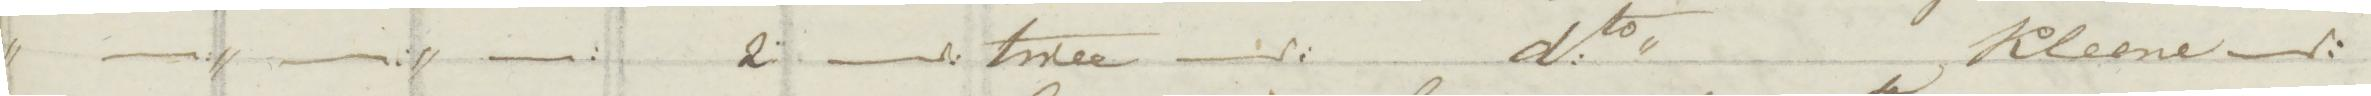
„ —:„ —:„ —: 2: _: twee —: d:„to kleene _:
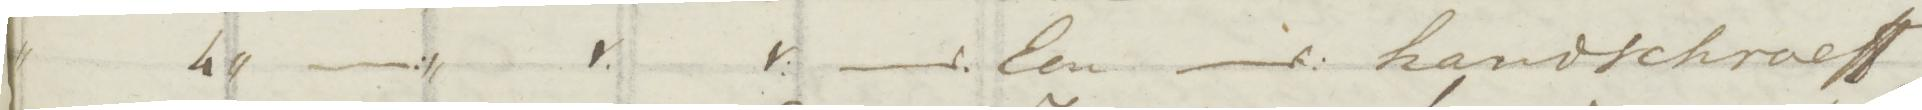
„ 4„ —:„ 1. 1: _: Een _: handschroeff
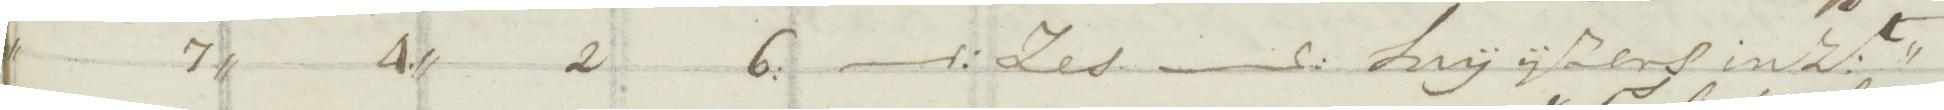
„ 7„ 4„ 2. 6: _: zes _: snij ijzers inz:„t
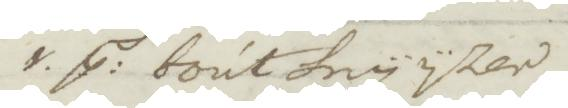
1: p:s bout snij ijzer
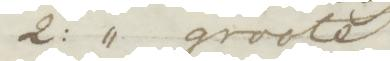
2: „ groote
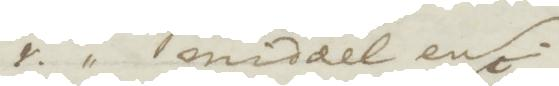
1. „ middel en
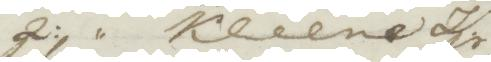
2: „ Kleene z
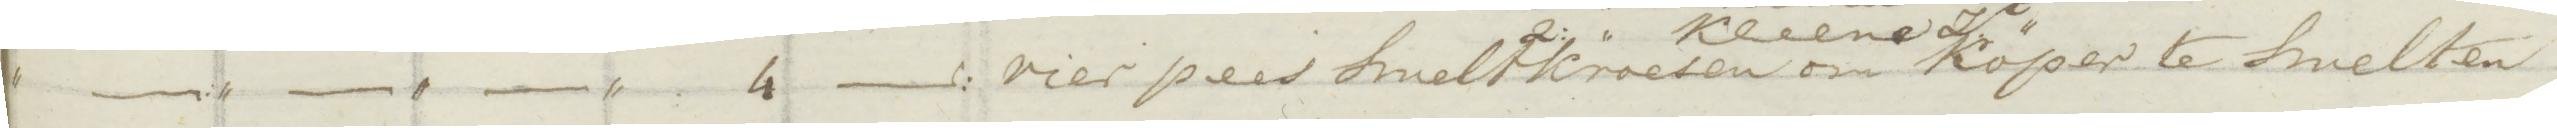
„ —:„ —:„ —:„ 4 _: vier pees smeltkroesen om koper te smelten
